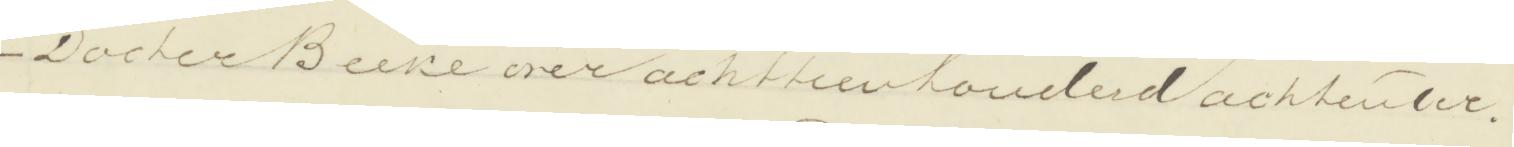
Docter Beeke over achttienhonderd achtender.
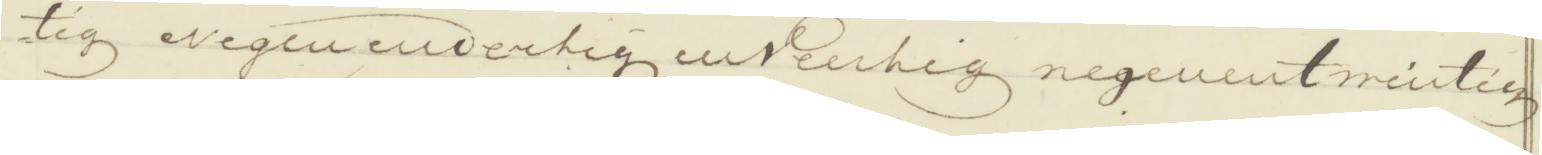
=tig negen endertig en Veertig negenentwintig
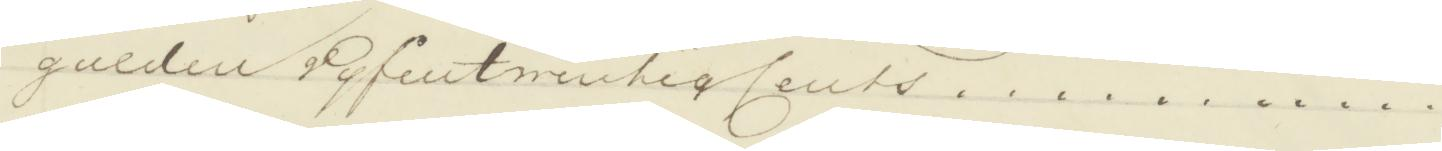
gulden Vyfentwintig Cents . . . . . . . . . . . . . „
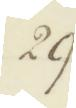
29 25
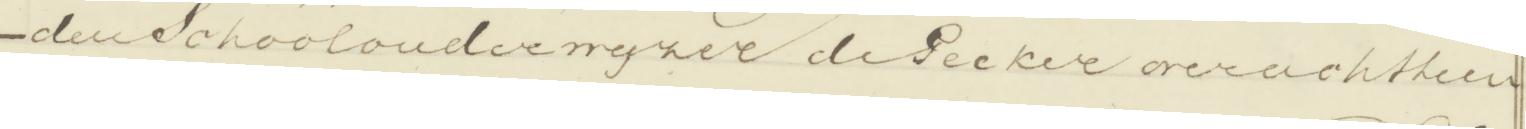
den Schoolonderwyzer de Pecker over achttien
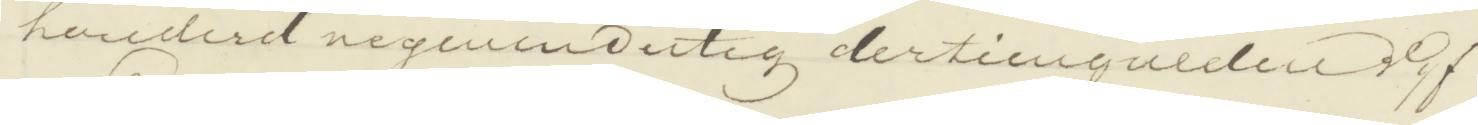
honderd negenendertig dertien gulden Vyf
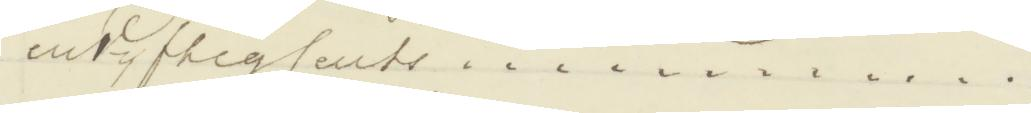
en Vyftig Cents . . . . . . . . . . . . . . . . . . . . . . . „
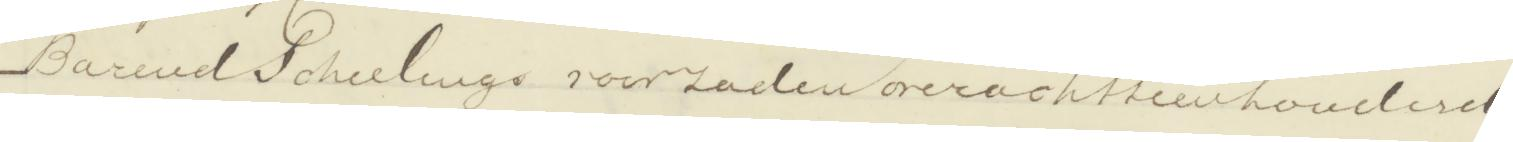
Barend Scheelings voor zaden over achttienhonderd
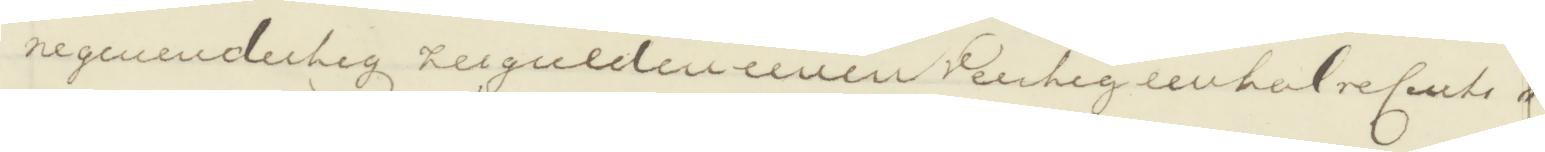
negenendertig zes gulden eenen Veertig een halve Cents
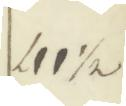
41½
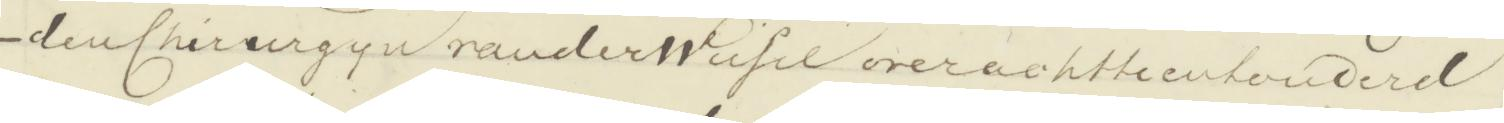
den Chirurgyn van der Weisel over achttienhonderd
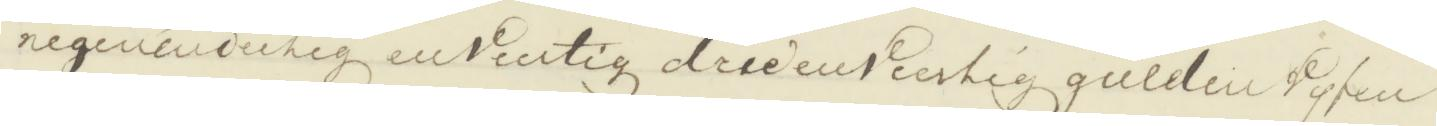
negenendertig en Veertig drie en Veertig gulden Vyfen
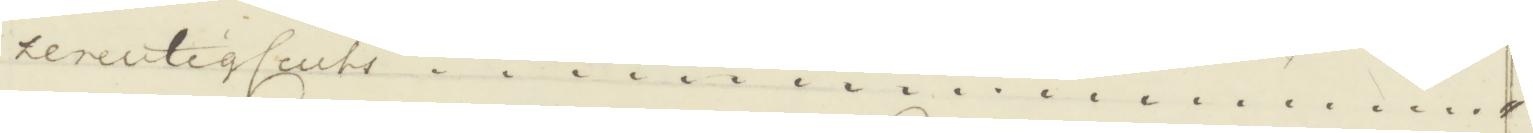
zeventig Cents . . . . . . . . . . . . . . . . . . . . . . „
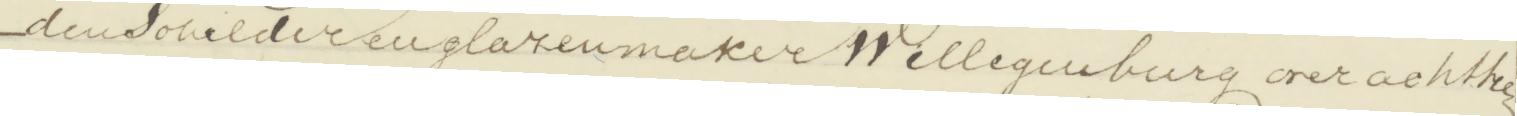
den Schilder en glazenmaker Willegenburg over achttien
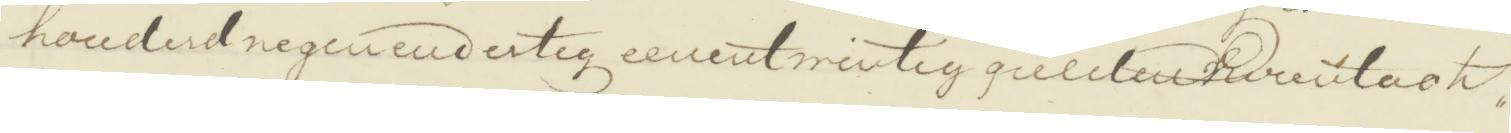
honderd negenendertig eenentwintig gulden Vierentacht„
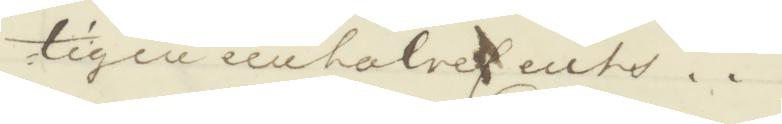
=tig en een halve Cents . . . . . . . . . . . . . . . . . „
